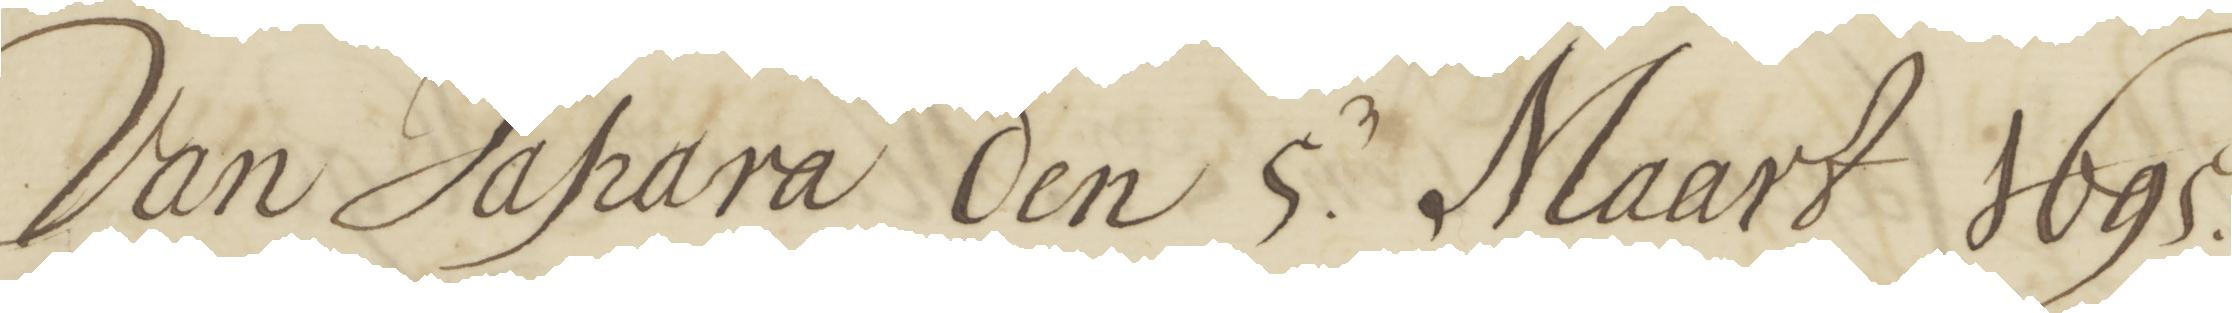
Van Japara den 5.en Maart 1695.
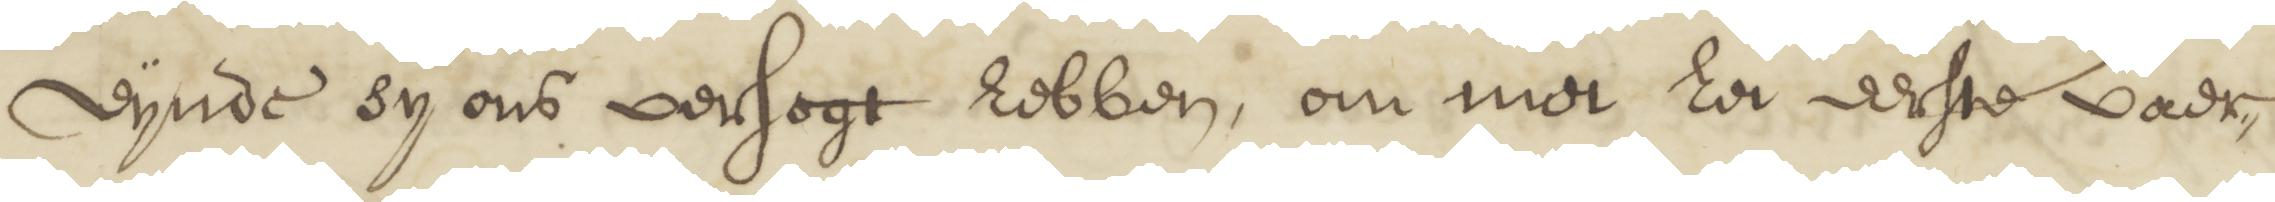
eijnde sij ons versogt hebben, om met het eerste vaer„
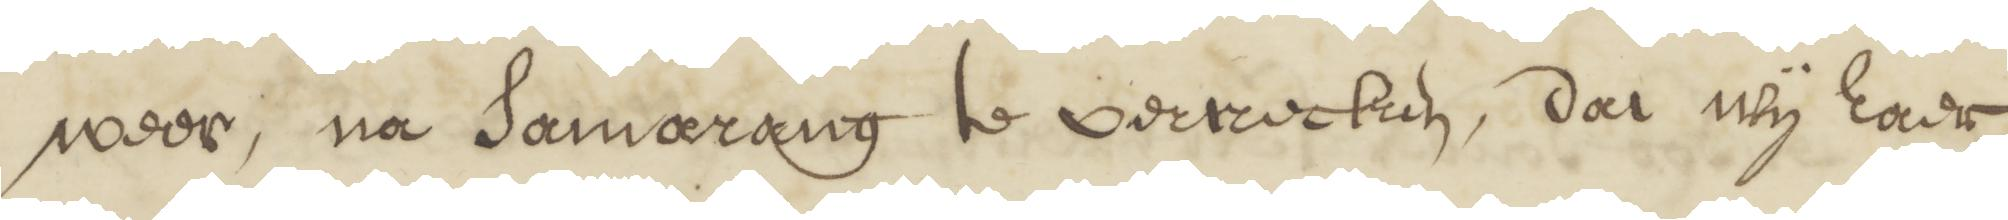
weer, na samarang te vertrecken, dat wij haer
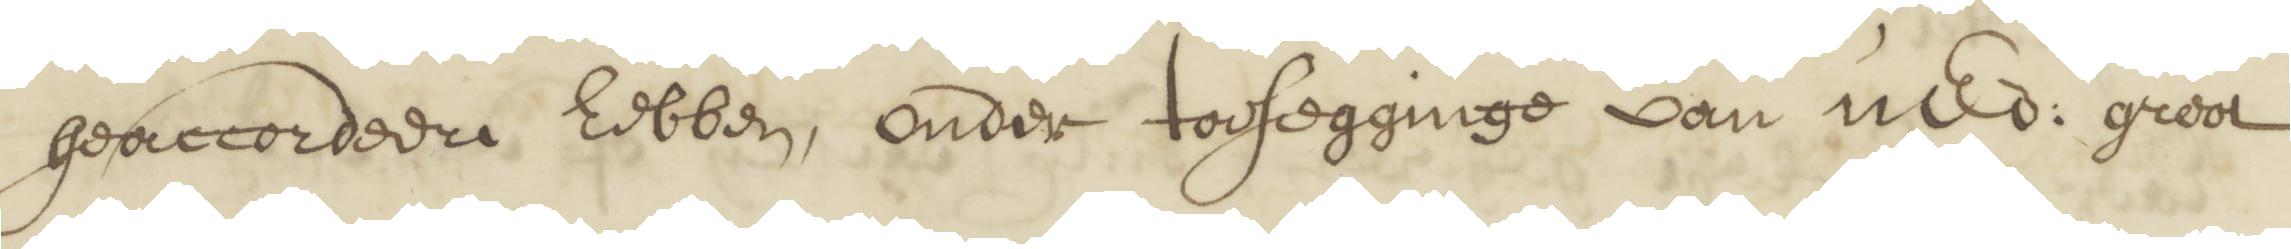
geaccordeert hebben, onder toesegginge van uEd: groot
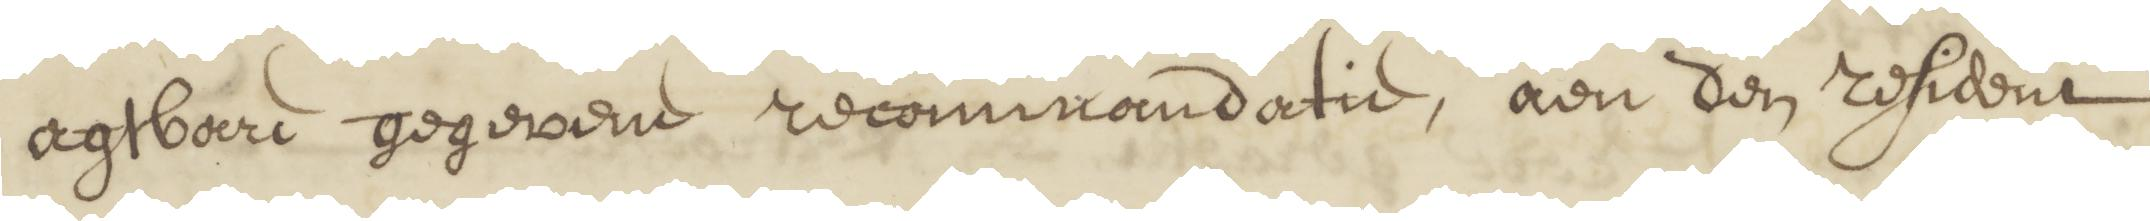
agtbare gegevene recominandatie, aen den resident
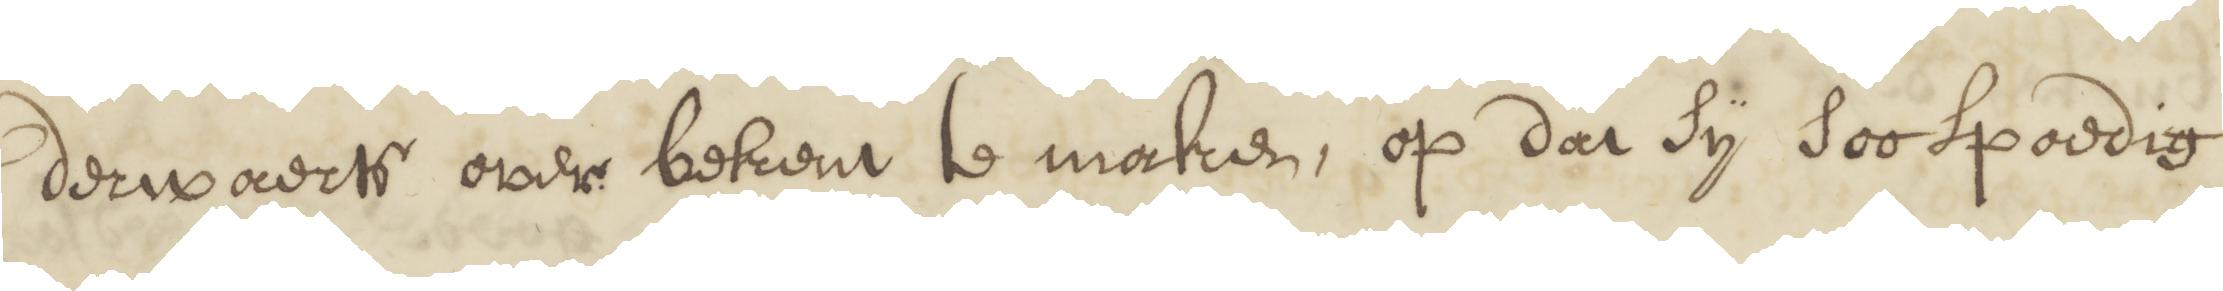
derwaerts over bekent te maken, op dat sij soo spoedig
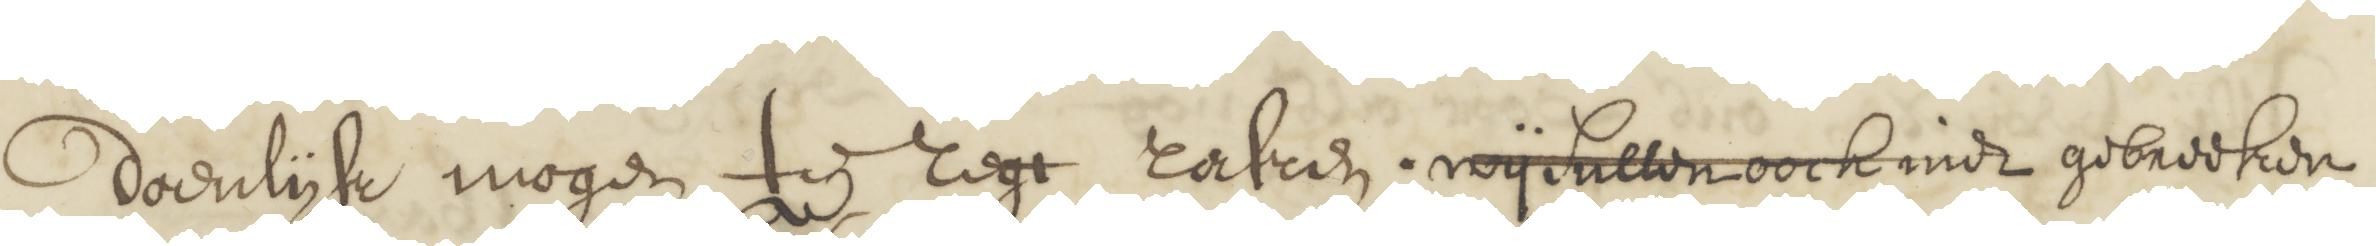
doenlijk mogen te regt raken. wij sullen oock niet gebreeken
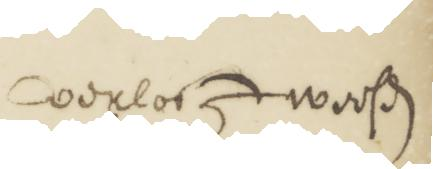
verlost weesen
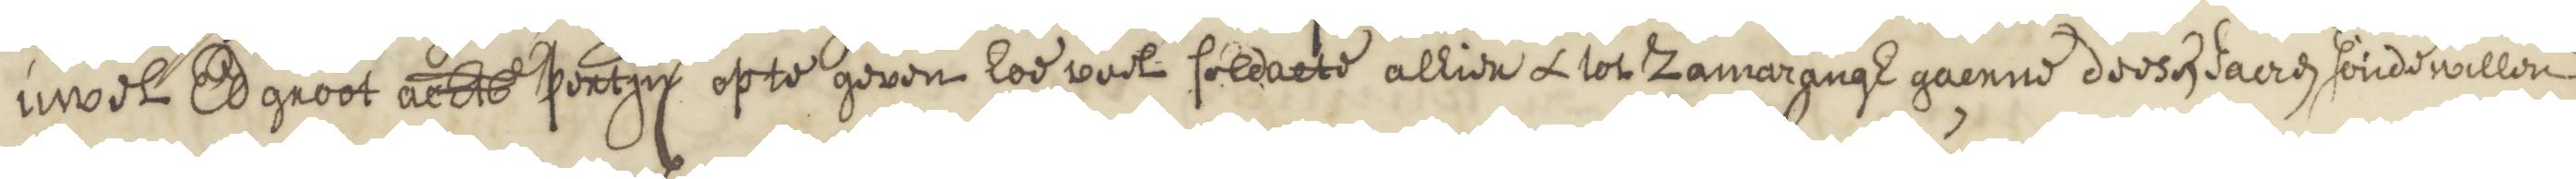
uwel Ed groot achtb pertjn/ opte geven hoe veel soldaete alhier & tot zamarangh gaerne deesen Jaeren soude willen
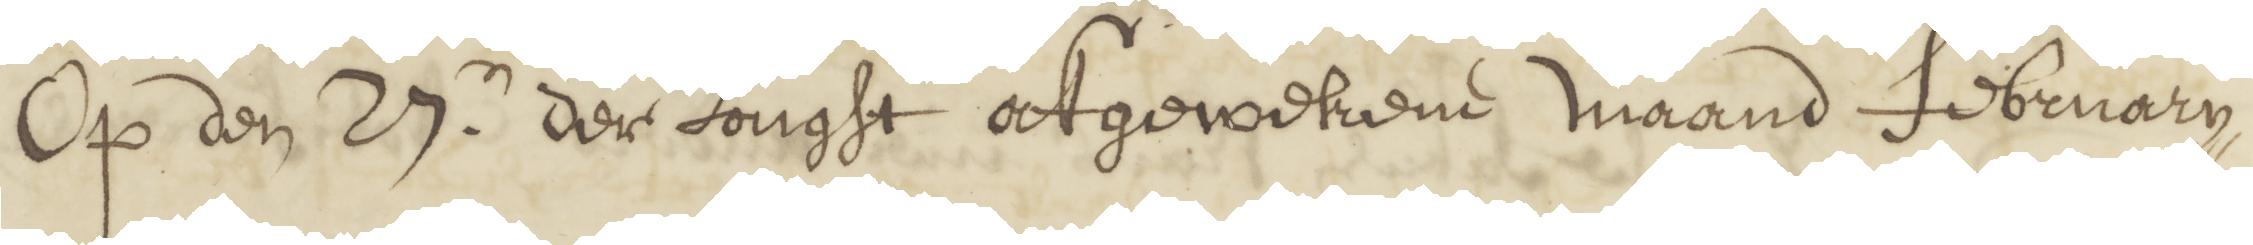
Op den 27.en der Jongst afgewekene maand februarij,
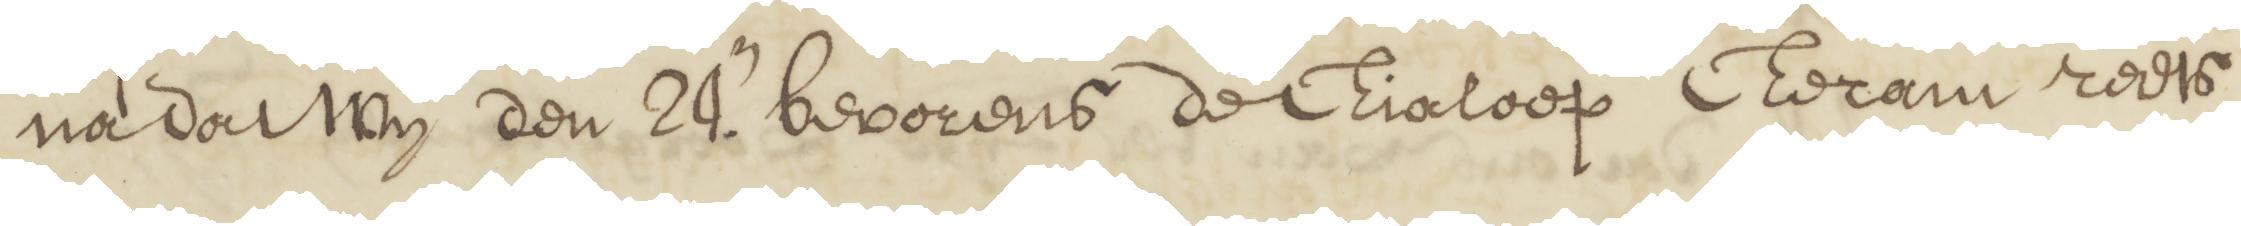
na dat wij den 24.en bevorens de Chialoep Cheram reets
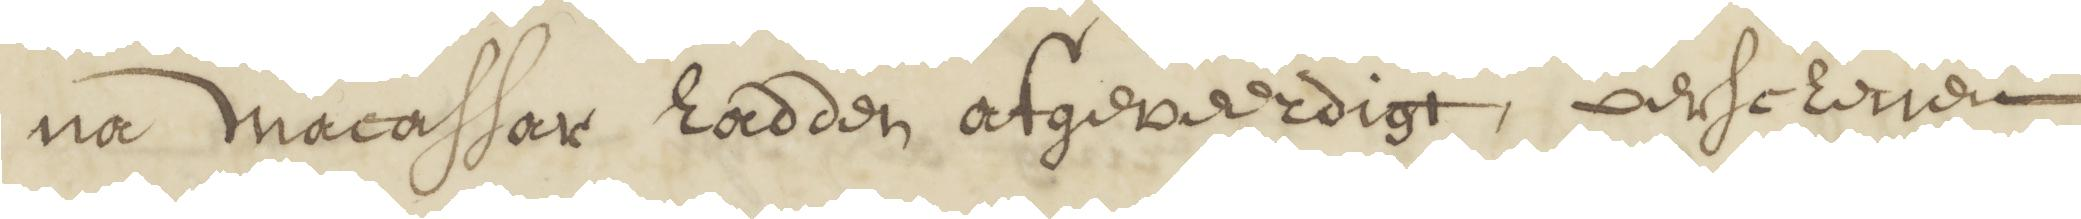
na Macassar hadden afgeveerdigt, verschenen
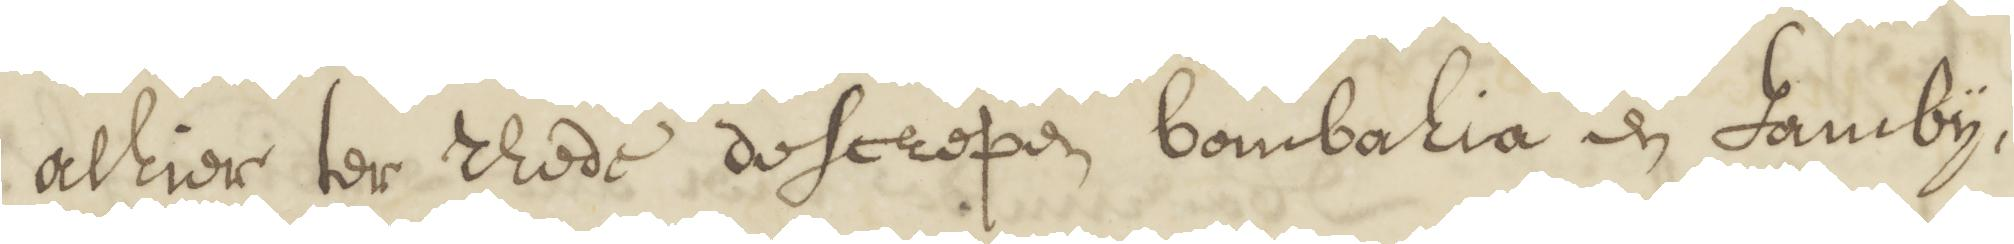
alhier ter rhede de schepen bombahia en Jambij,
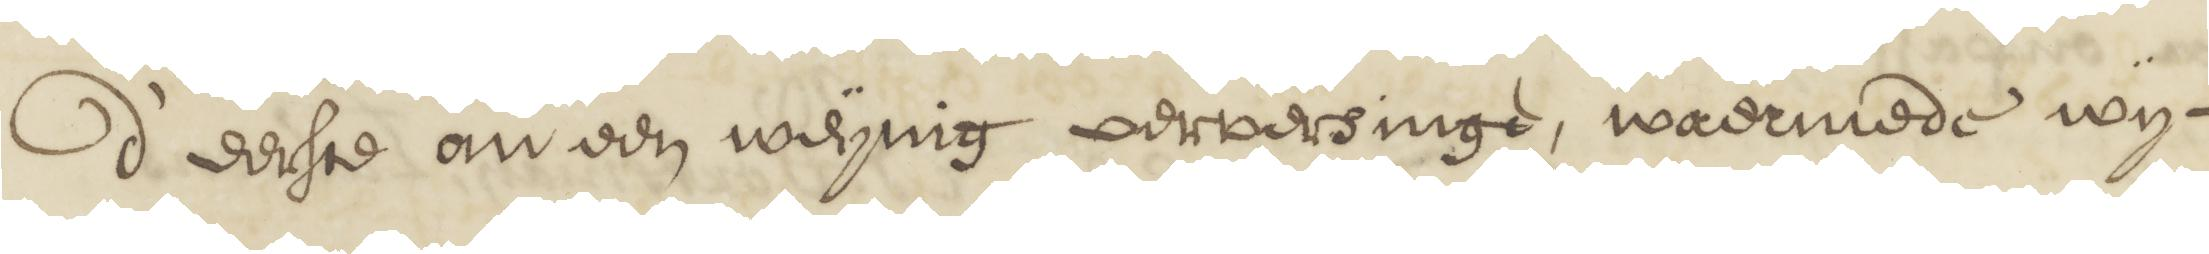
d’eerste om een weijnig verversinge, waermede wij
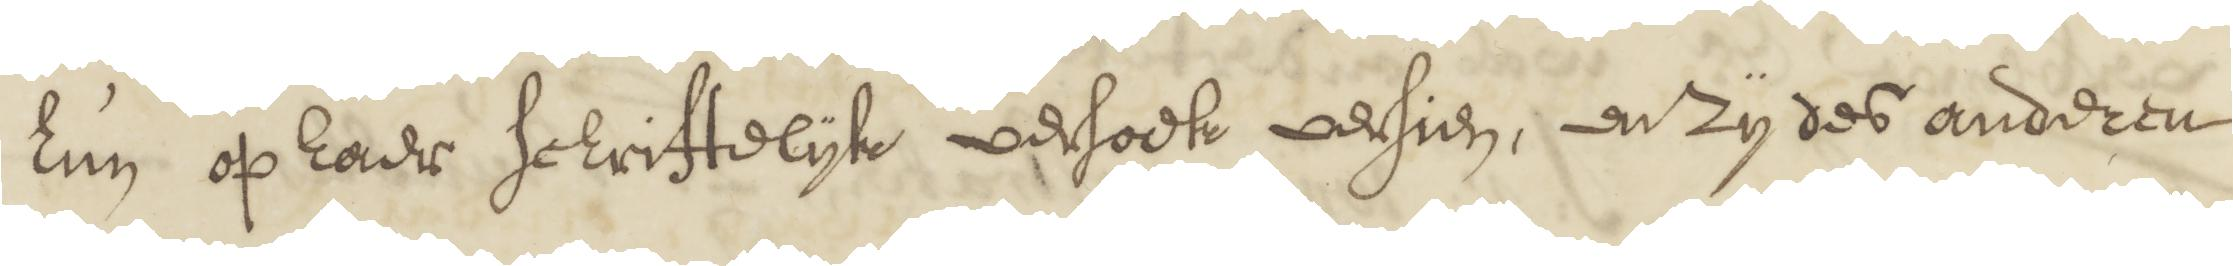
hun op haer schriftelijk versoek versien, en zij des anderen
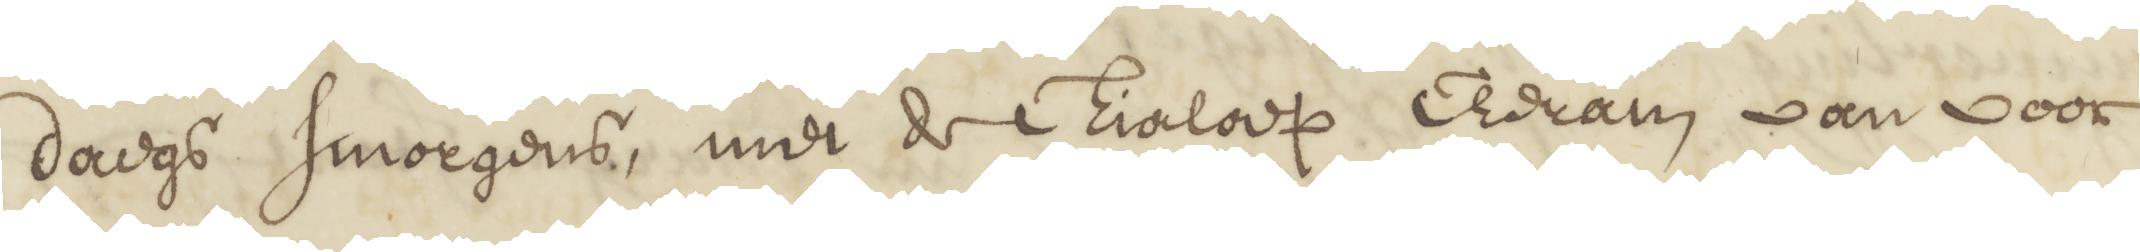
daegs smorgens, met de Chialoep Cheram van voor
